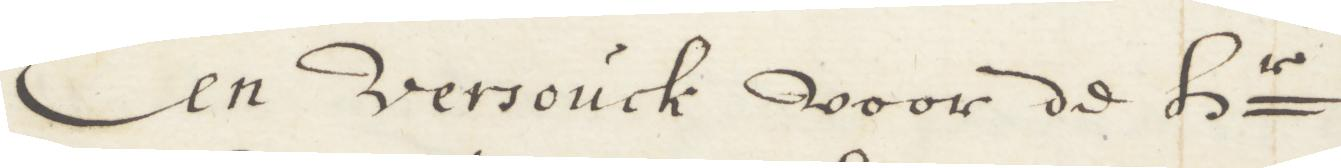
Een versouck voor de h=r
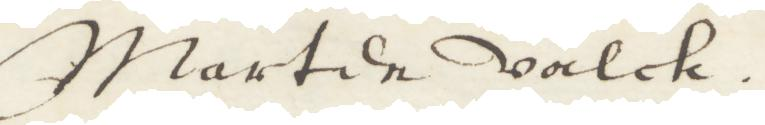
Marter valck.
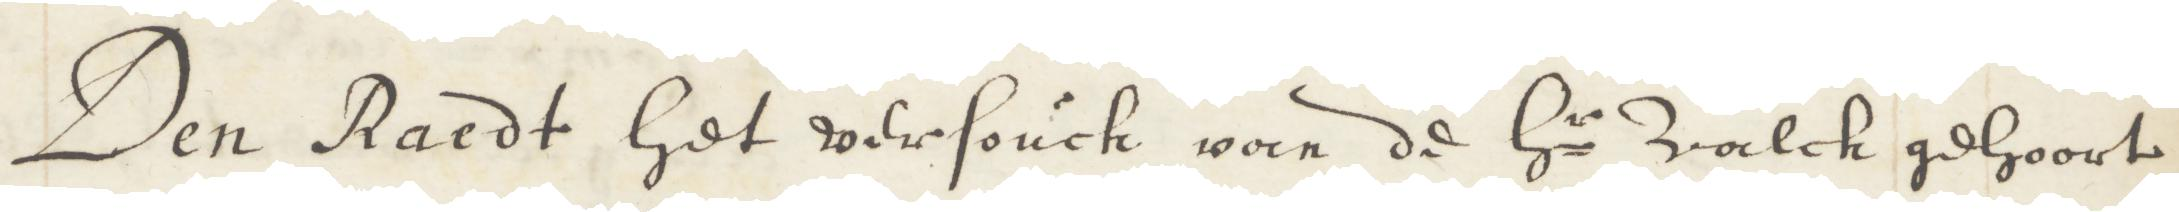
Den Raedt het versouck voor de h=r valck gehoort
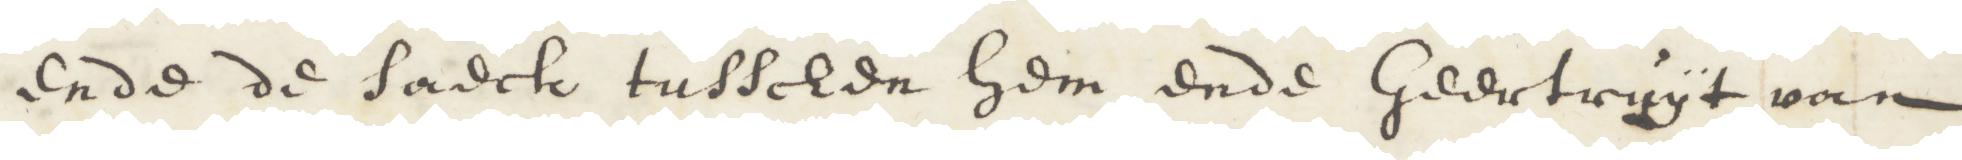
ende de saeck tusschen hem ende Geertruijt van
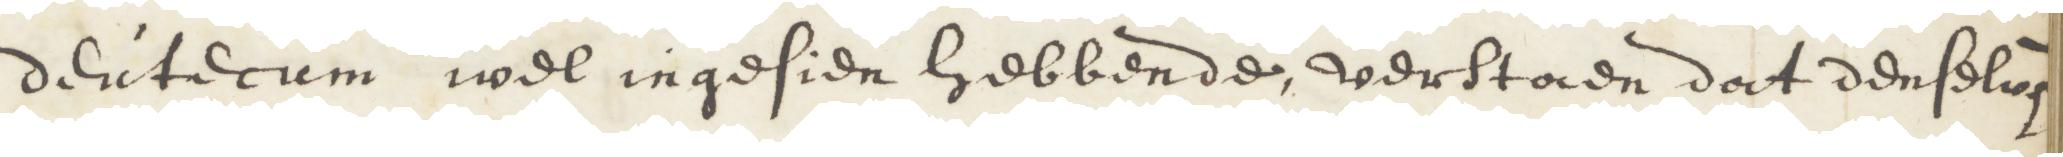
deutecum wel ingesien hebbende, verstaen dat denselven
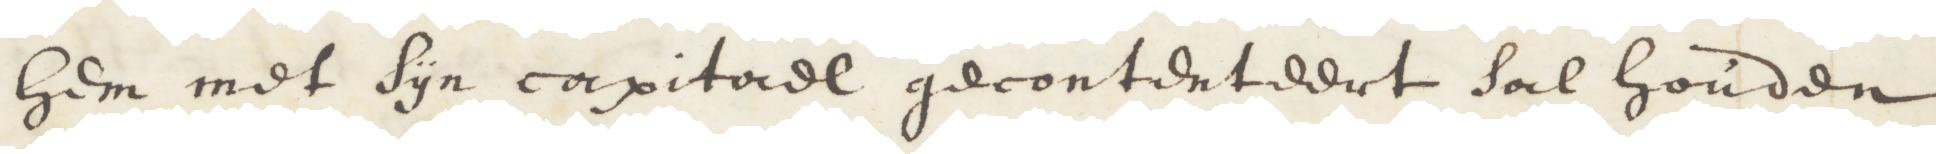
hem met sijn capitael gecontenteert sal houden
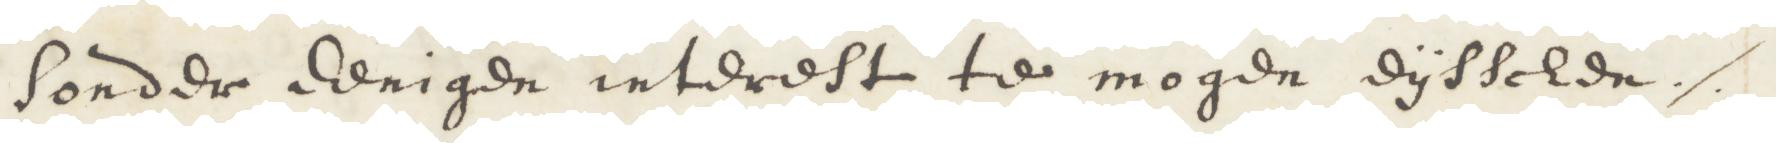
sonder Eenigen interest te mogen eijsschen./.
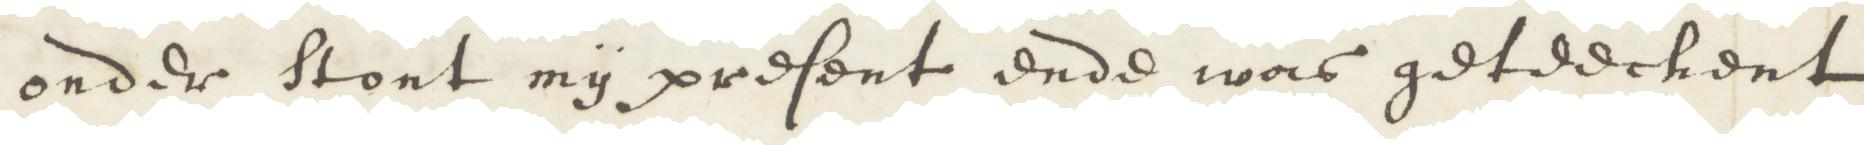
onder stont mij present ende was geteeckent
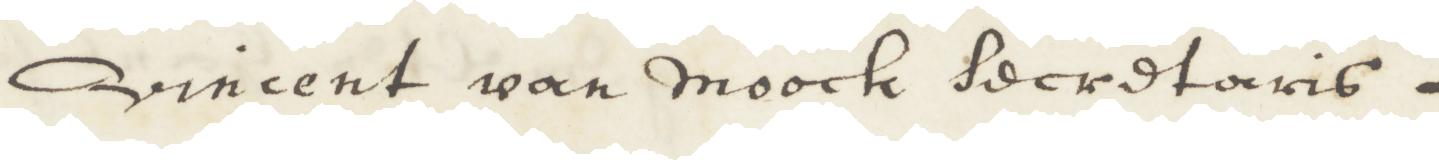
Vincent van moock secretaris
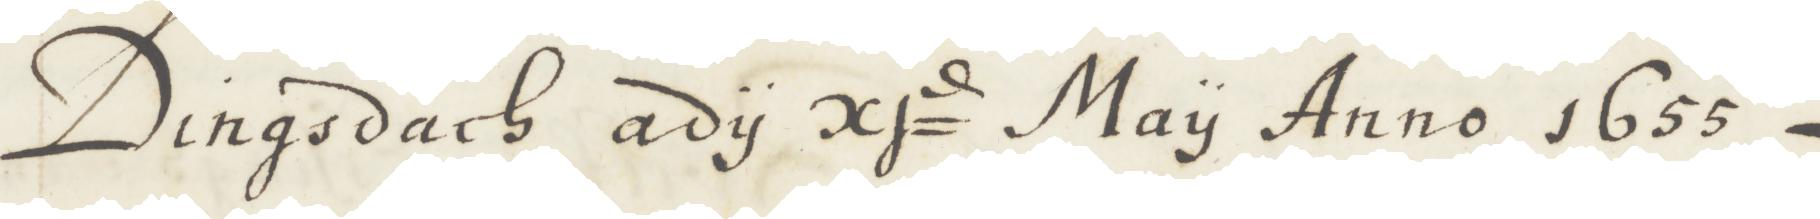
Dingsdach adij xj=e Maij Anno 1655
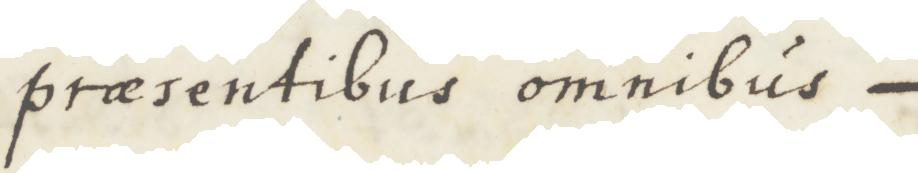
praesentibus omnibus —
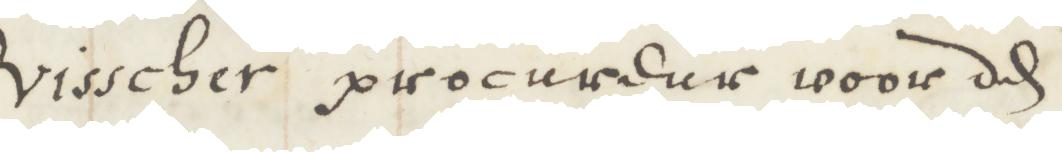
Visscher procureur voor den
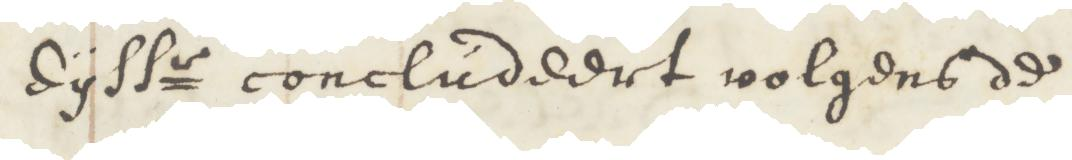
Eijss=r concludeert volgens de
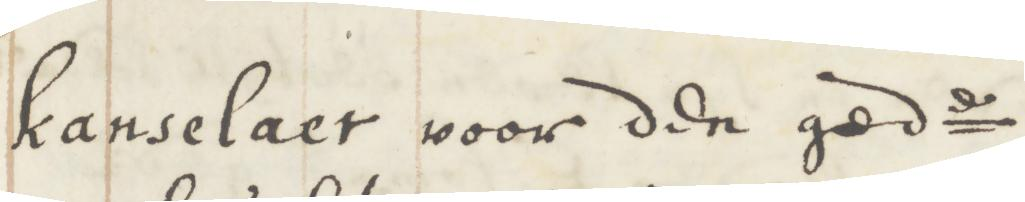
kanselaer voor den ged=e
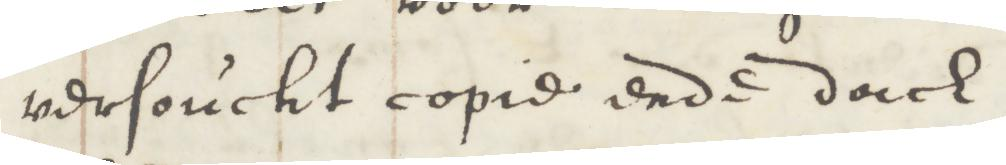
versouckt copie ende dach
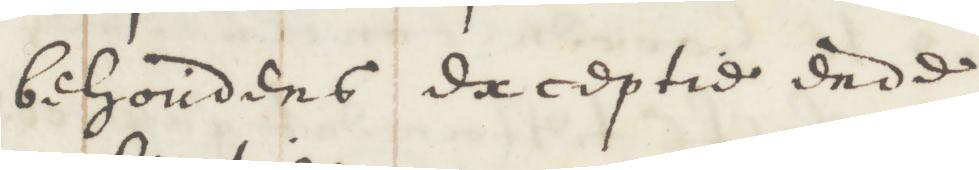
behoudens exceptie ende
